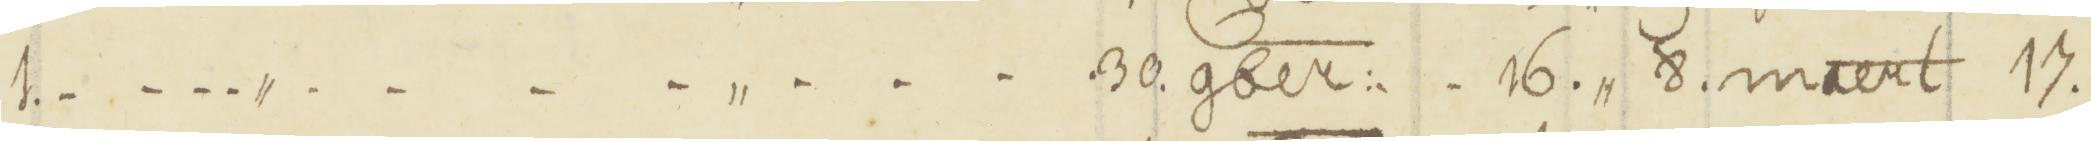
1.....„.....„.....30. gber: 16. „ 8. maert 17.
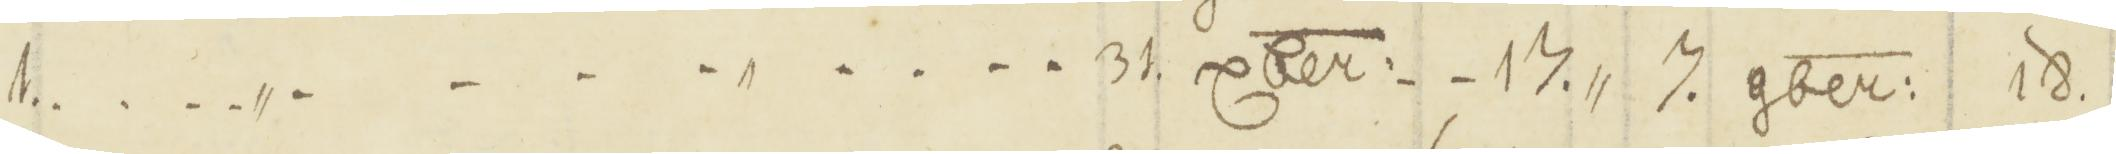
1.....„.....„.....31. xber: 17. „ 7: gber: 18.
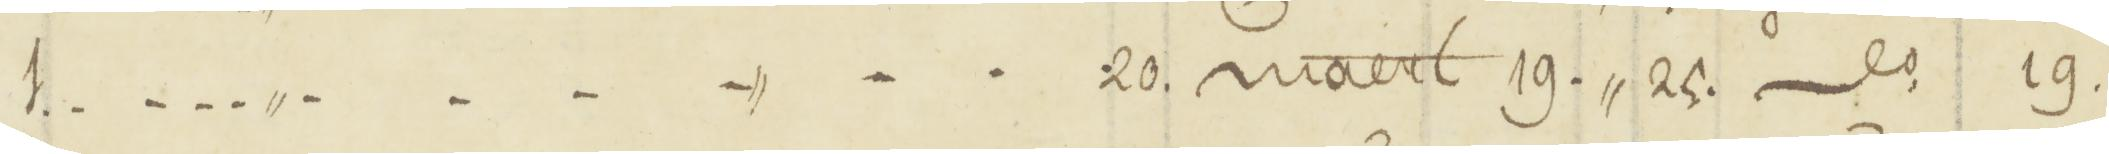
1.....„.....„.....20. maert 19. „ 25. _:o 19.
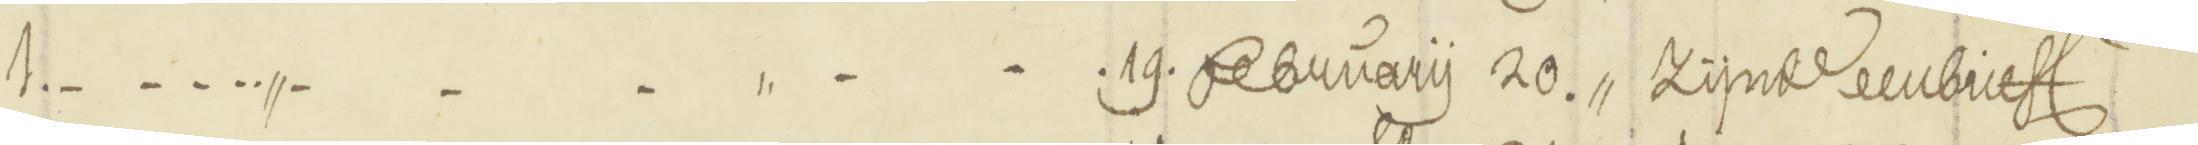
1.....„.....„.....19. februarij 20. „ zijnde eenbrieff
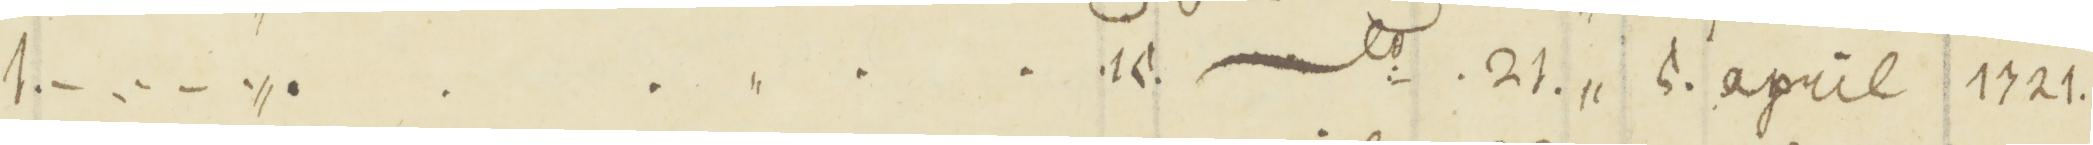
1.....„.....„.....15. _:o. 21. „ 5. april 1721.
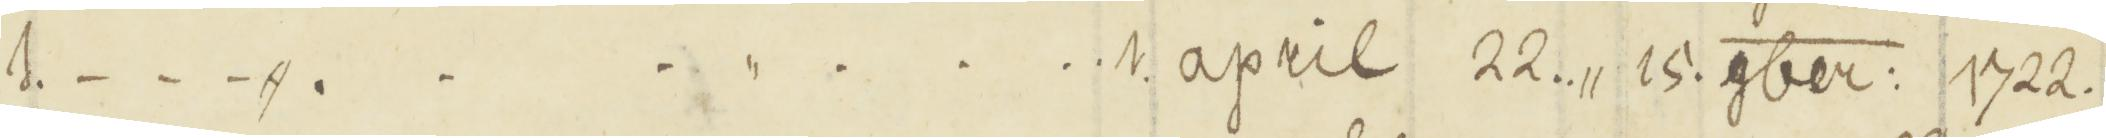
1.....„.....„.....1. april 22. „ 15. gber: 1722.
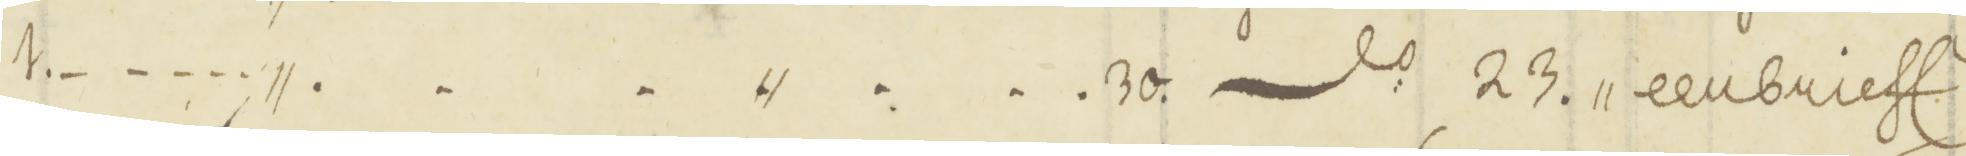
1.....„.....„.....30: _:o 23. „ een brieff
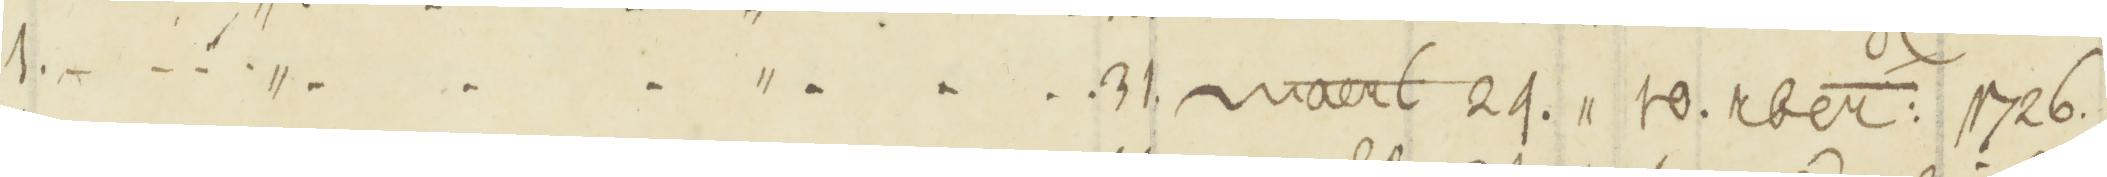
1.....„.....„.....31 maert 24. „ 10. xber: 1726.
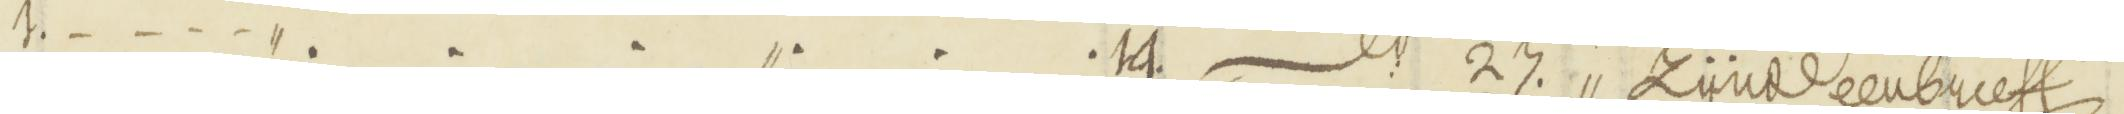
1.....„.....„.....14. _:o 27. „ zijnde een brieff
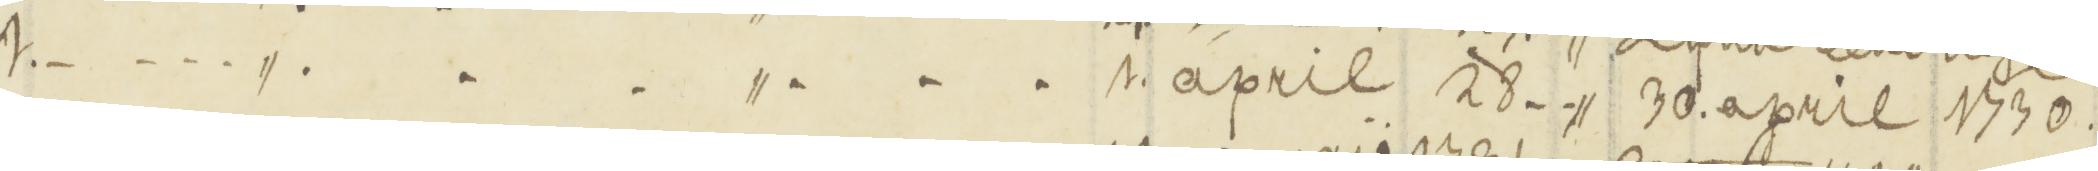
1.....„.....„.....1. april 28...„ 30. april 1730.
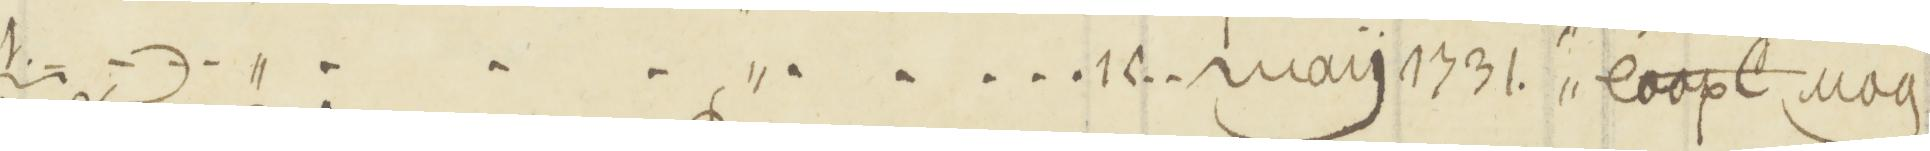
1.....„.....„.....15. maij 1731. „ loopt nog
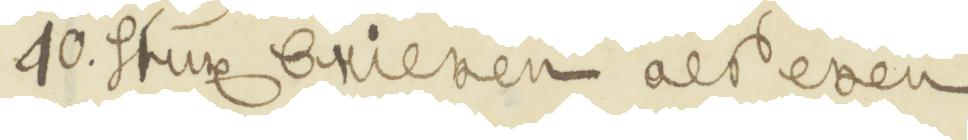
40. stux brieven als even
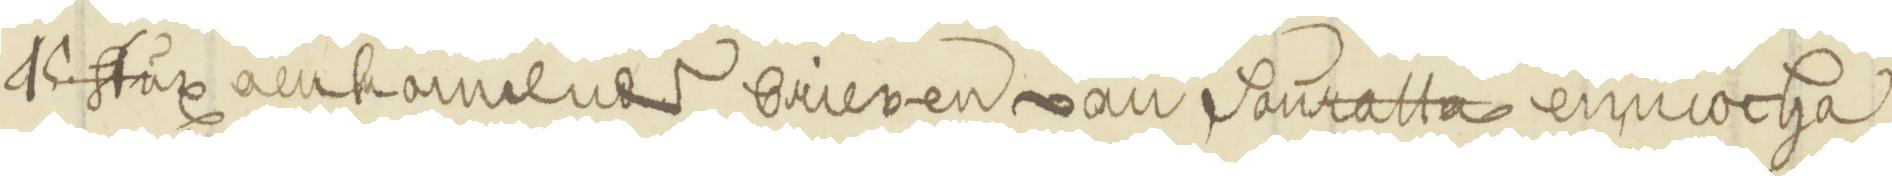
45 stux aenkomende brieven van Souratta en mocha
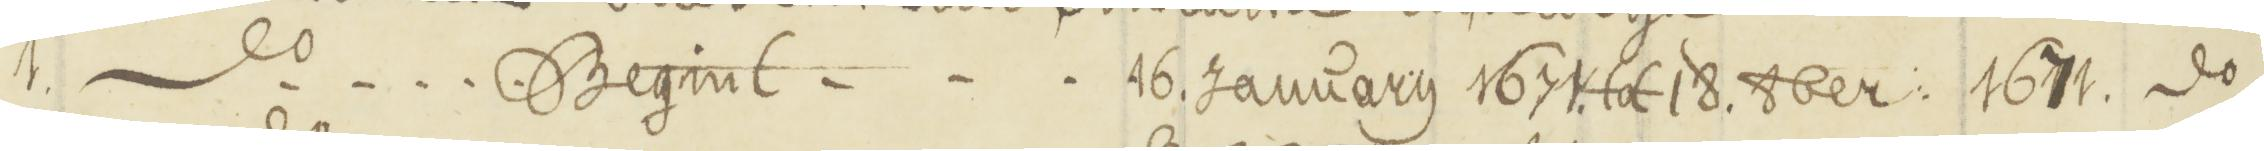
1. _o.....Begint.....16. Januarij 1671 tot 18. 8ber: 1671. do
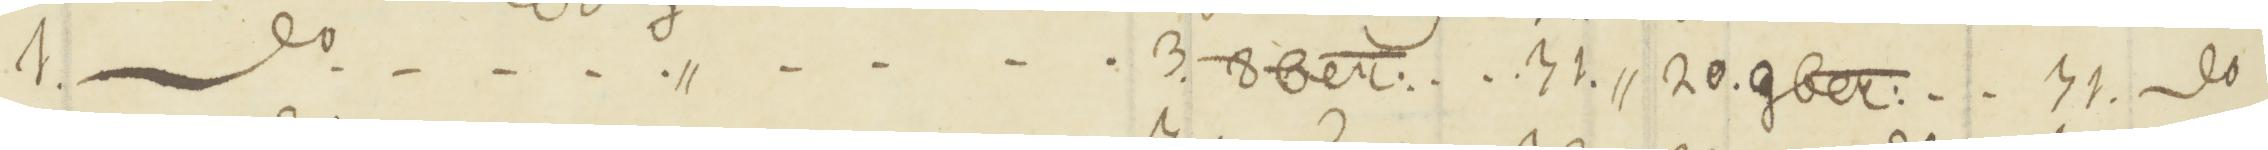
1. _o.....„.....3 8ber:... 71. „ 20. gber:... 71. do
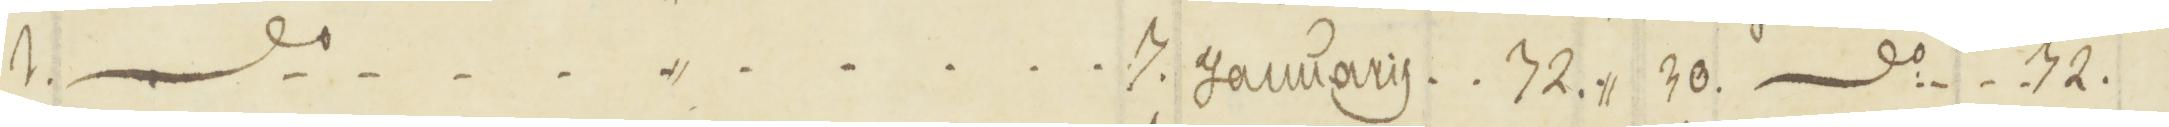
1. _o.....„....7. Januarij... 72. „ 30. _o...72
